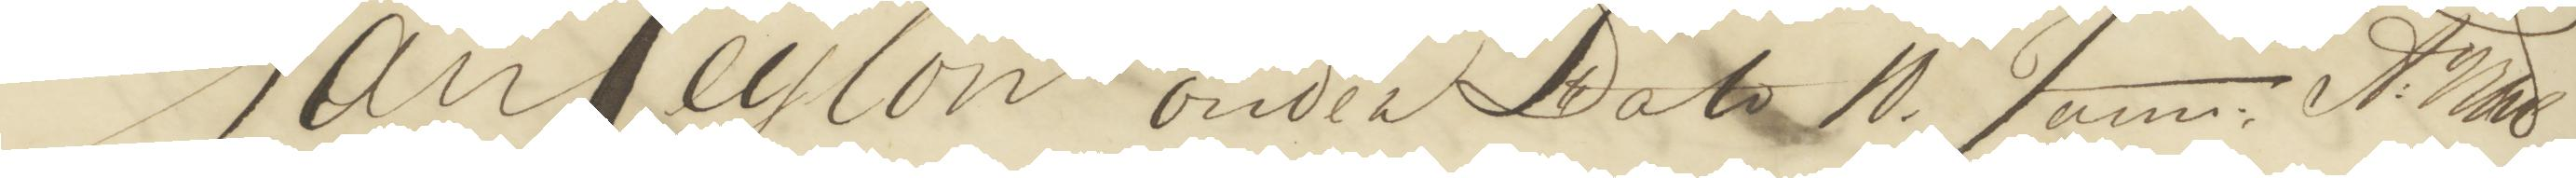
Van Ceylon onder Dato 10.' Jann: A:o 1748
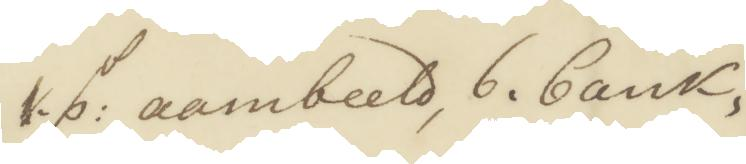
1. p:s aambeeld, 6. bank
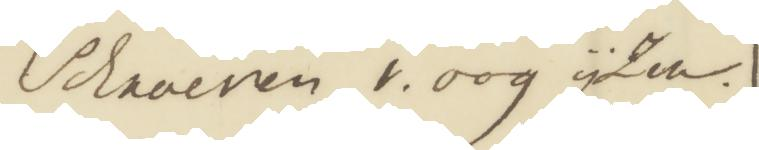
schroeven, 1. oog ijzer.
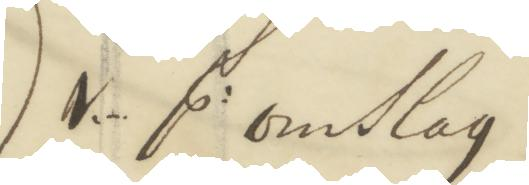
1.-. p:s omslag
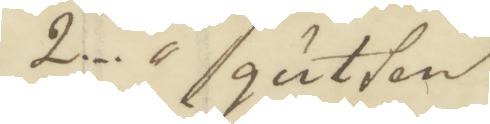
2.-. „ gutsen
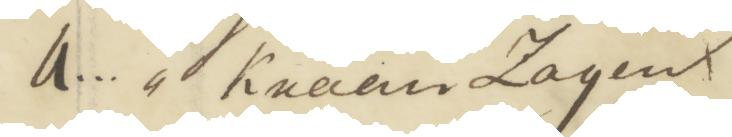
4... „ kraanzagen
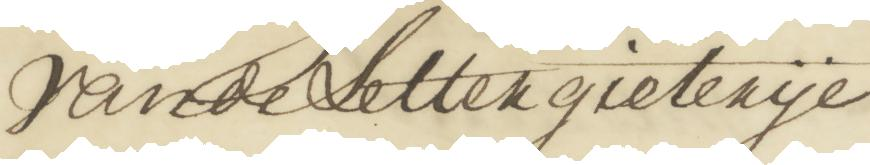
van de Lettergieterije
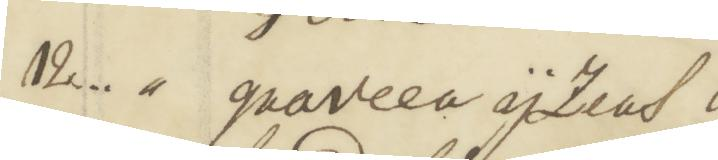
12.-. „ graveer ijzers
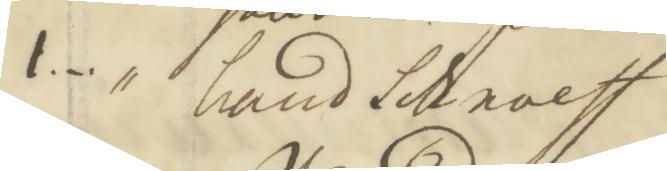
1.-. „ hand schroeff
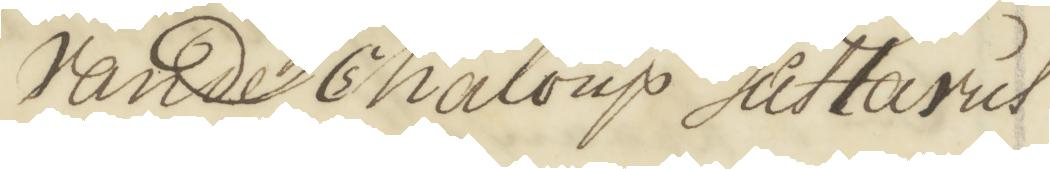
van de Chaloup Gustavus
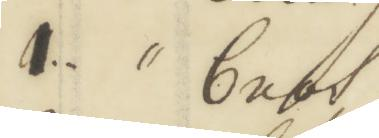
4.-. „ bros
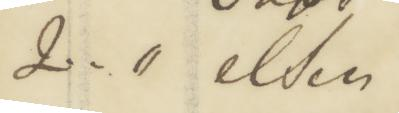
2.-. „ elsen
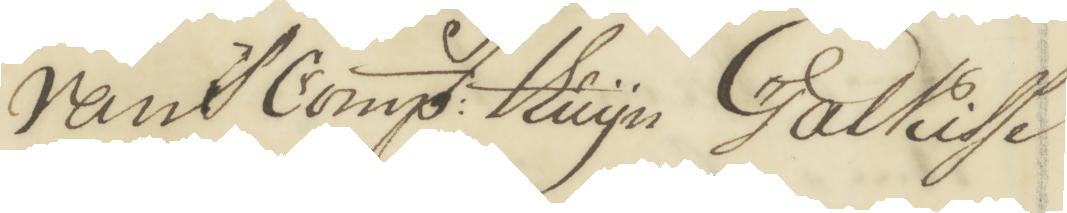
van 's Comp:s thuijn Galkisse
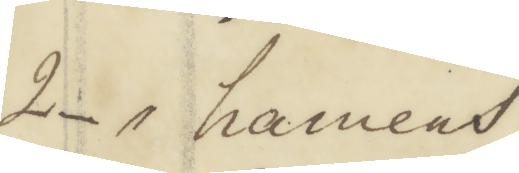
2_ „ hamers
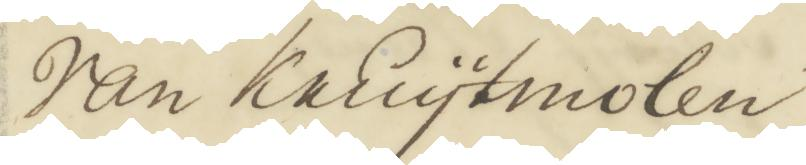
van Kruijtmolen
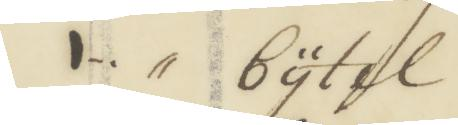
1-. „ bijtel
